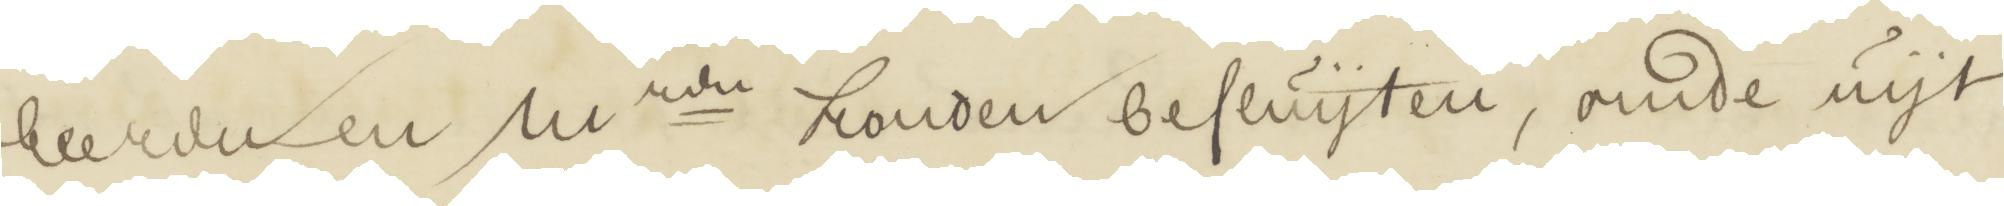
heeren en m=ren konden besluijten, om de uijt
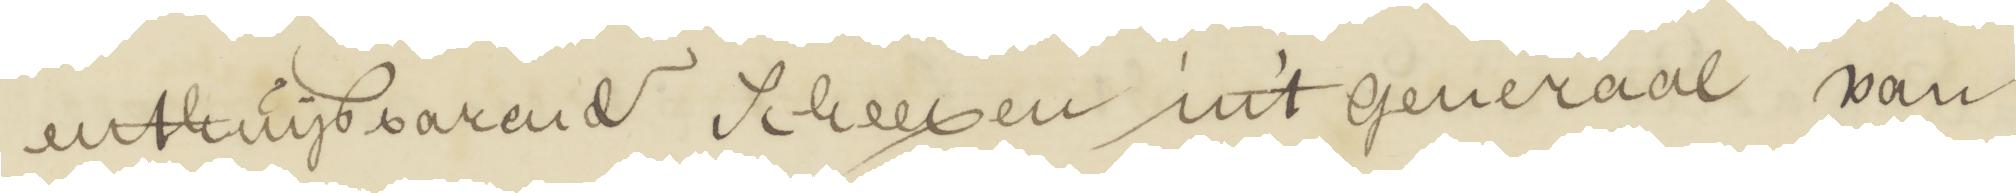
en thuijsvarende scheepen in’t generaal van
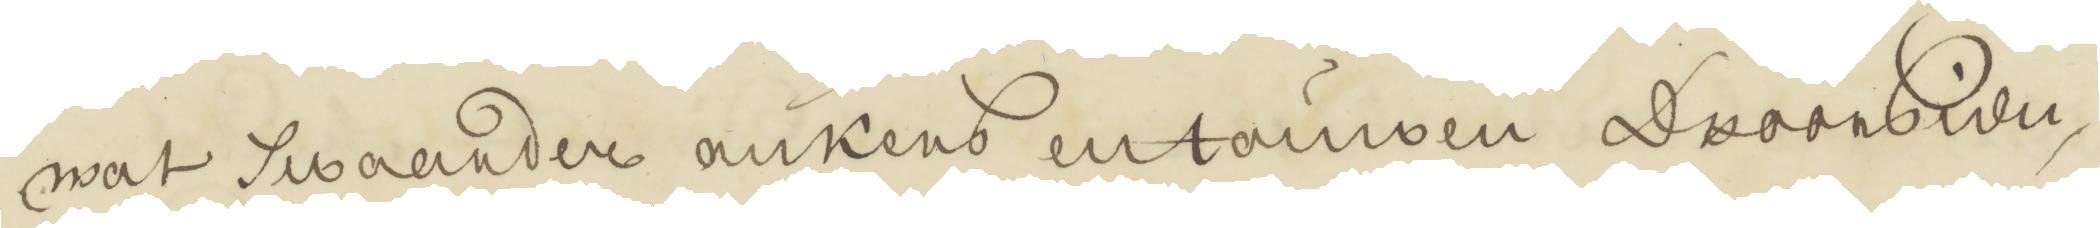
wat swaarder ankers en touwen tevoorsien,
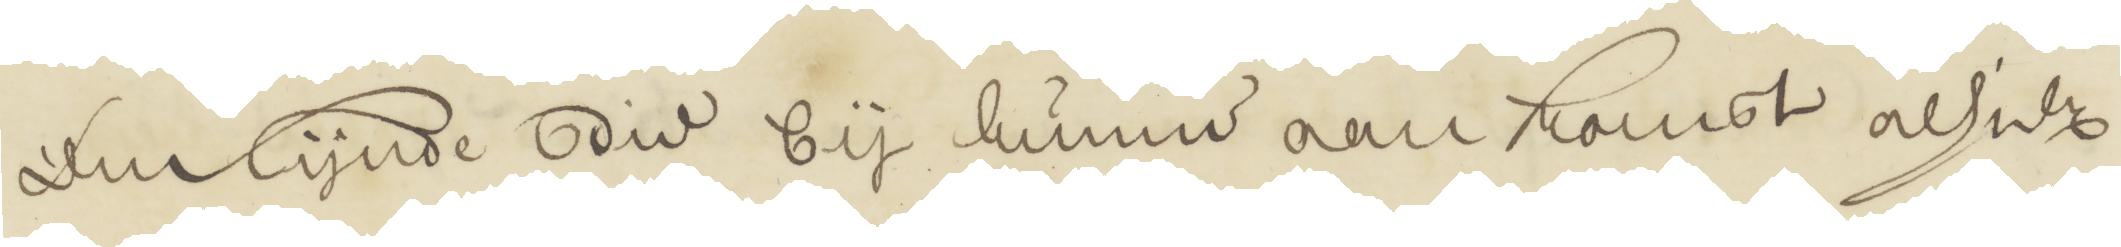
ten Eijnde die bij hunne aankomst alhier
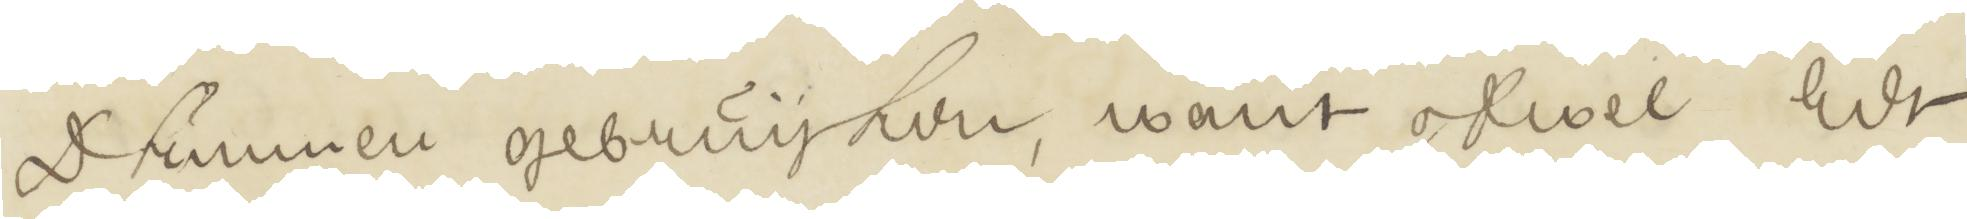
te kunnen gebruijken, want ofwel het
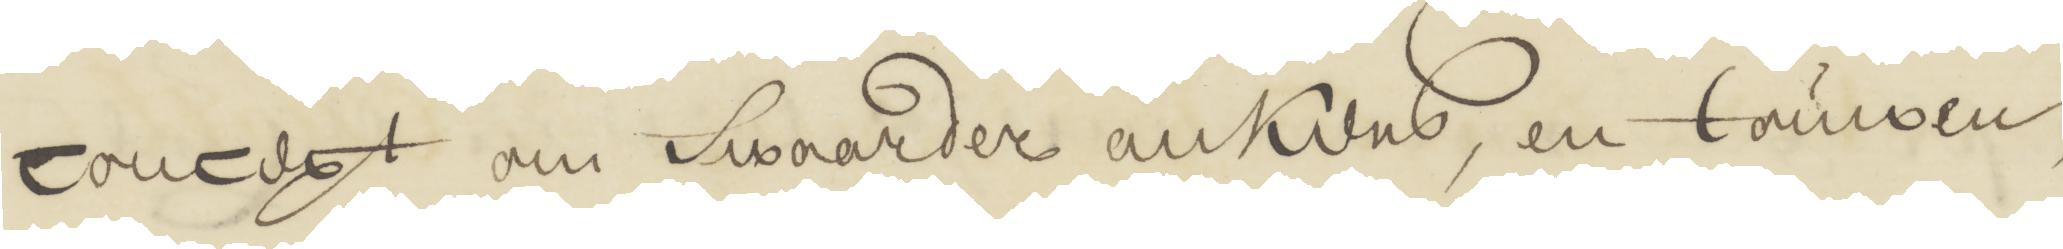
concept om swaarder ankers, en touwen
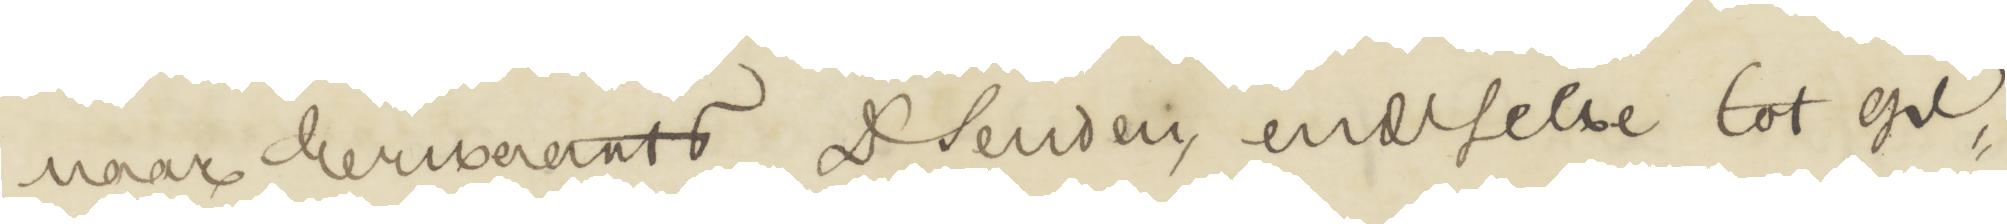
naar herwaarts tesenden, en deselve tot ge„
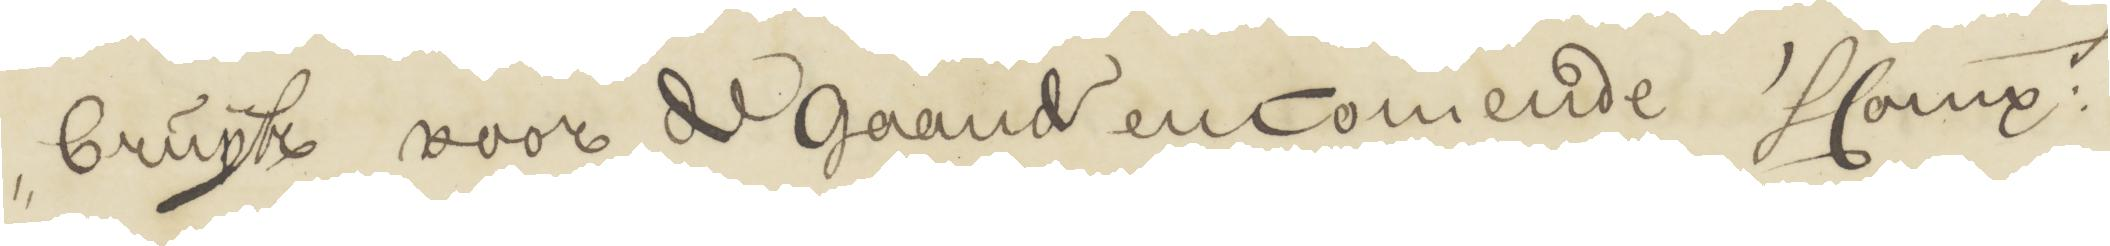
„bruijk voor de gaande en comende 'sComp:s
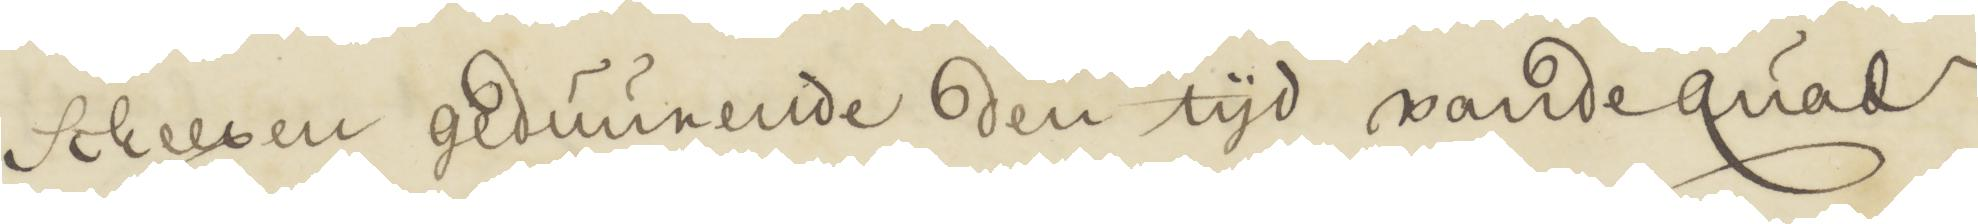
scheepen geduurende den tijd vande quade
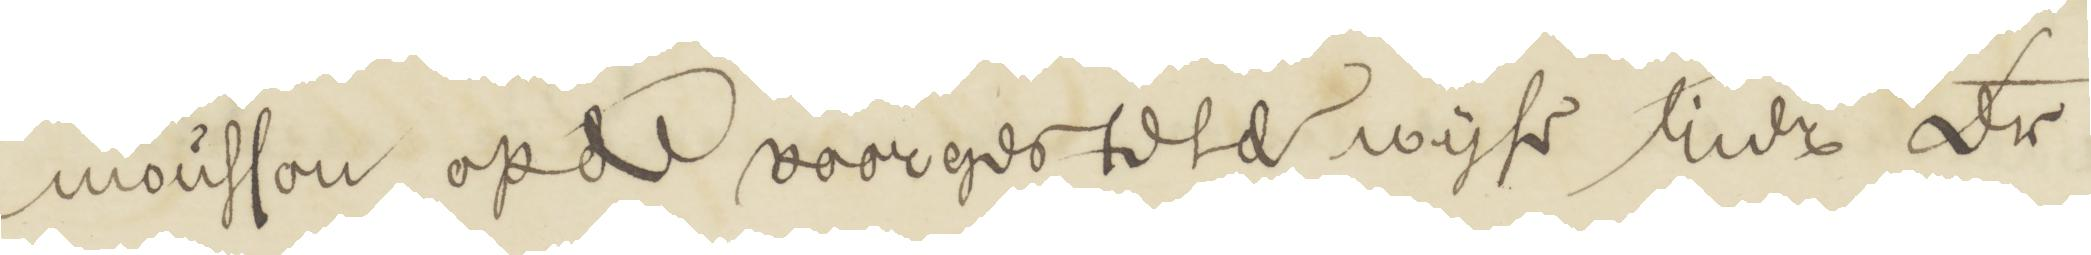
mousson op de voorgestelde wijse hier ter
